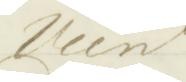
Veen
